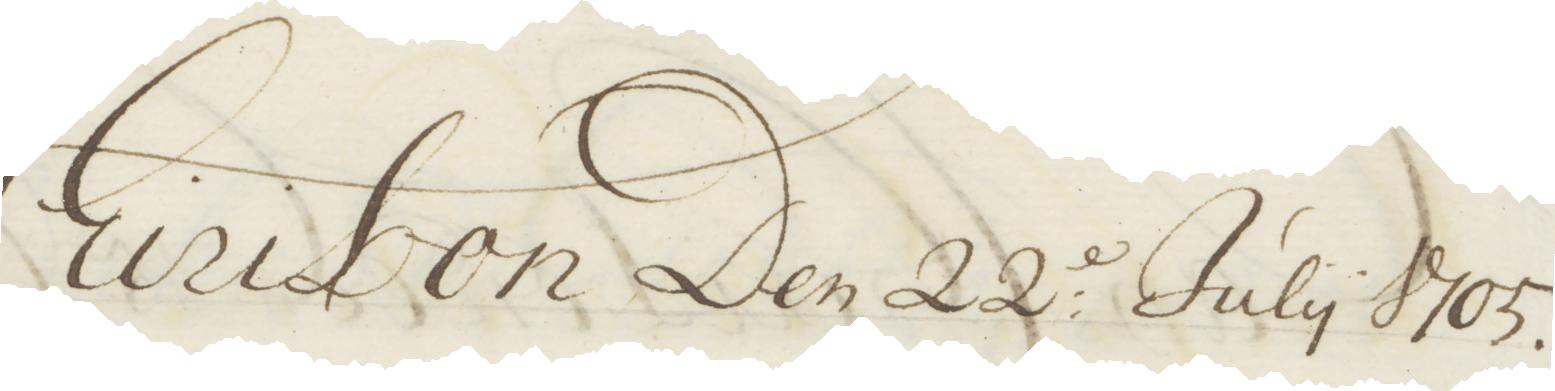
Van Chiribon Den 22:e Julij 1705.
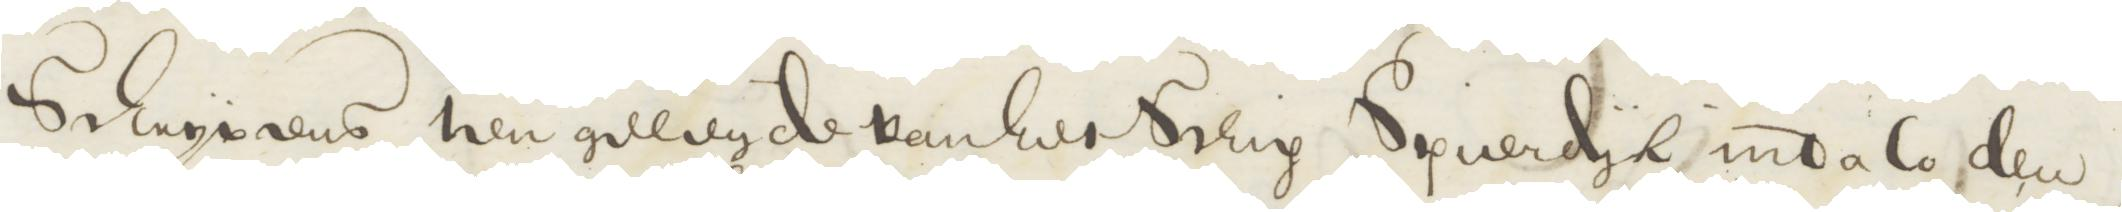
schrijvens ten geleyde van het schip spierdijk indato den
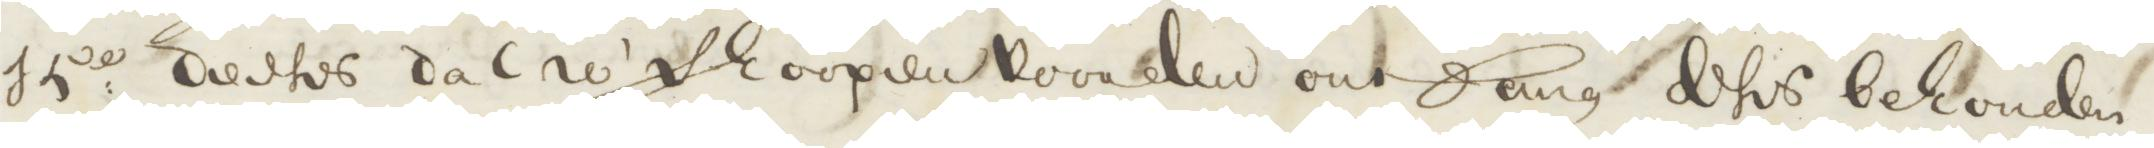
15:e deeses dat w' verhoopen voor den ontfang deses behouden
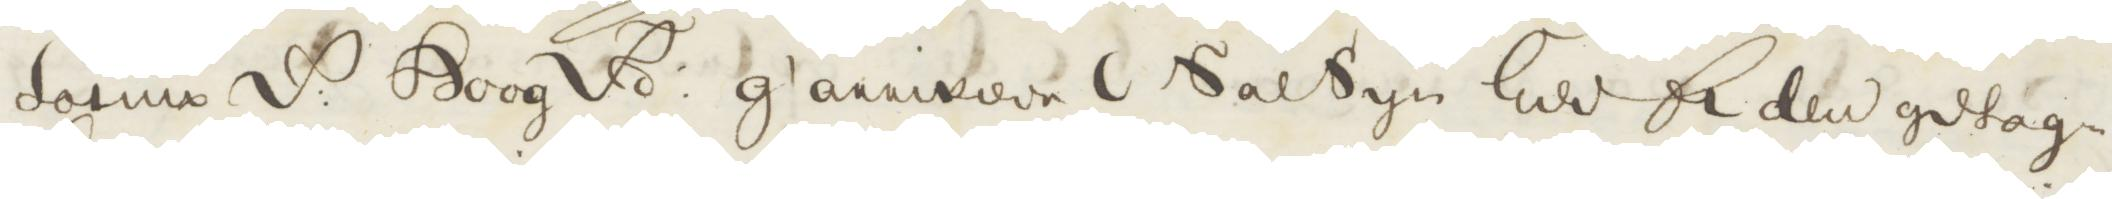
datum E: Hoog Ed: g’arriveert sal sijn heeft den gesag
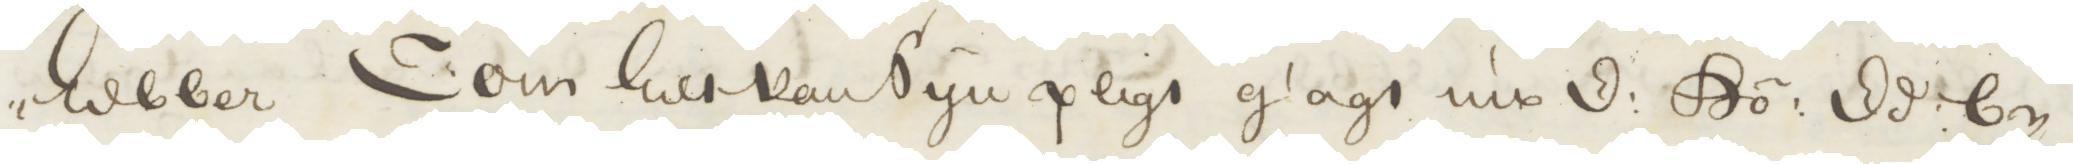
„hebber Coin het van sijn pligt g'agt uw E: Ho: Ed: bij
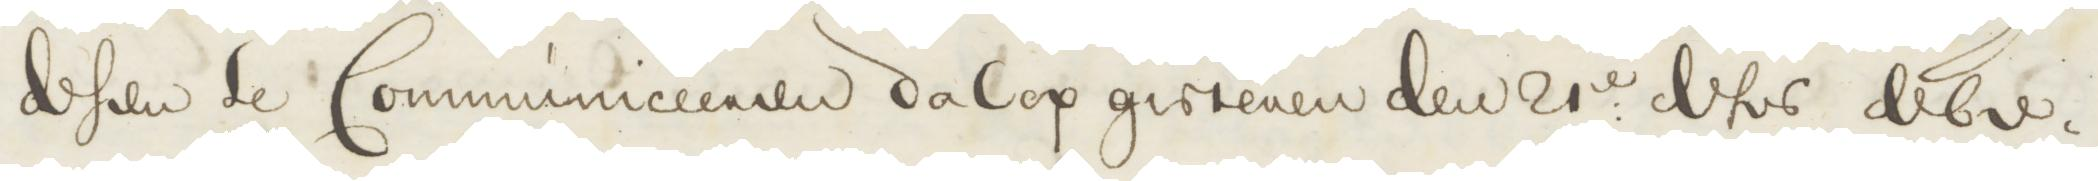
desen te communiceeren dat op gisteren den 21:e deses de be„
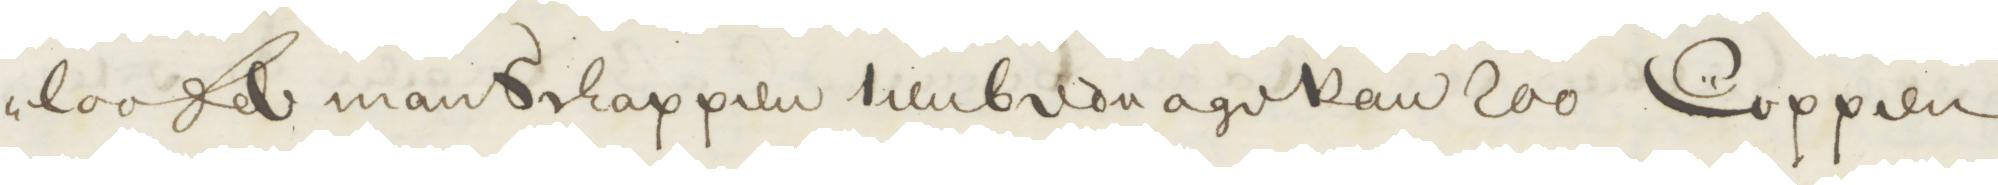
„loofde manschappen tien bedrage van 200 Coppen
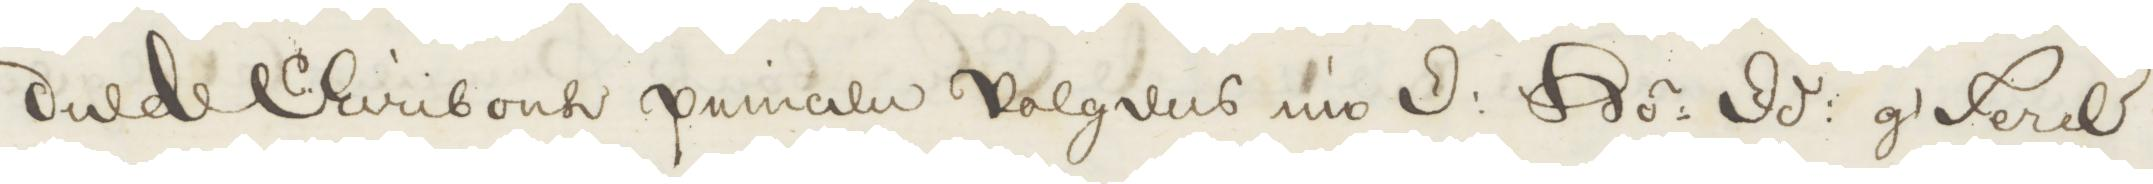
die de Chiribonse princen volgens uw E: He: Ed: g'Eerde
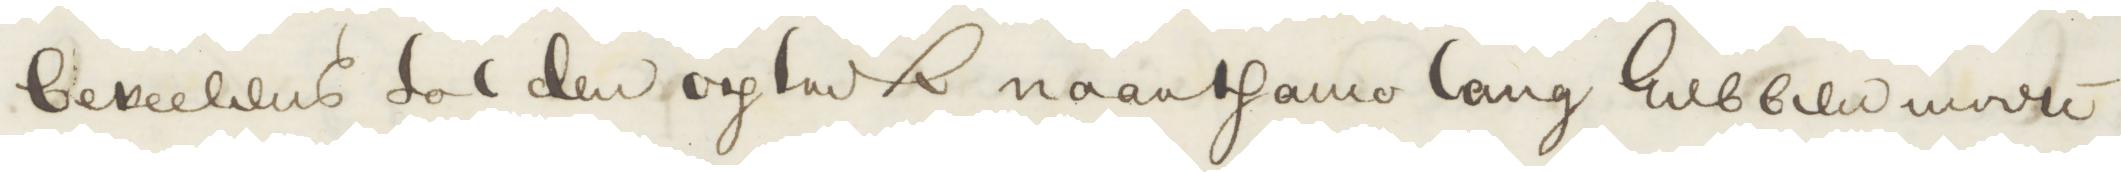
beveelens tot den optrek naar pamo tang hebben moete
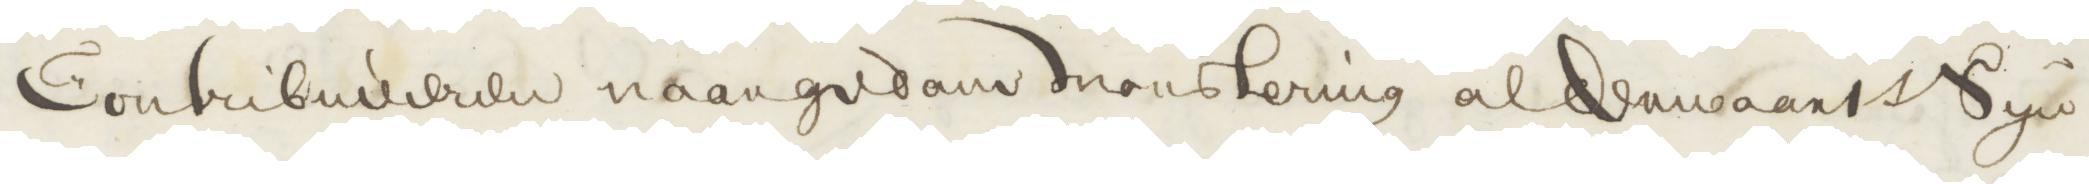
contribueeren naar gedane monstering al derwaarts sijn
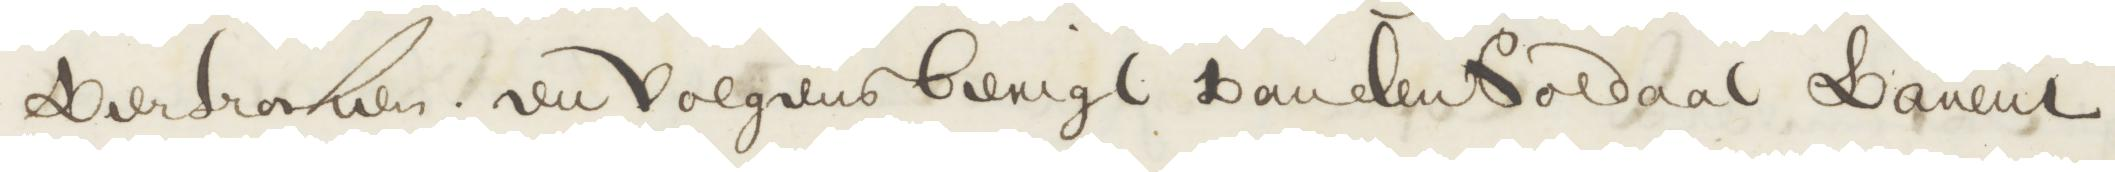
vertrocken. en volgens berigt van den soldaat Barent
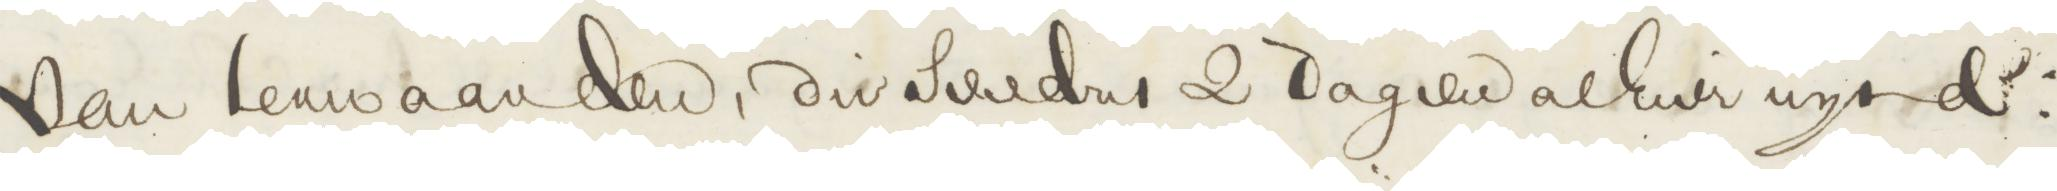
Van terwaarden, die seedrt 2 dagen alhier uijt d':
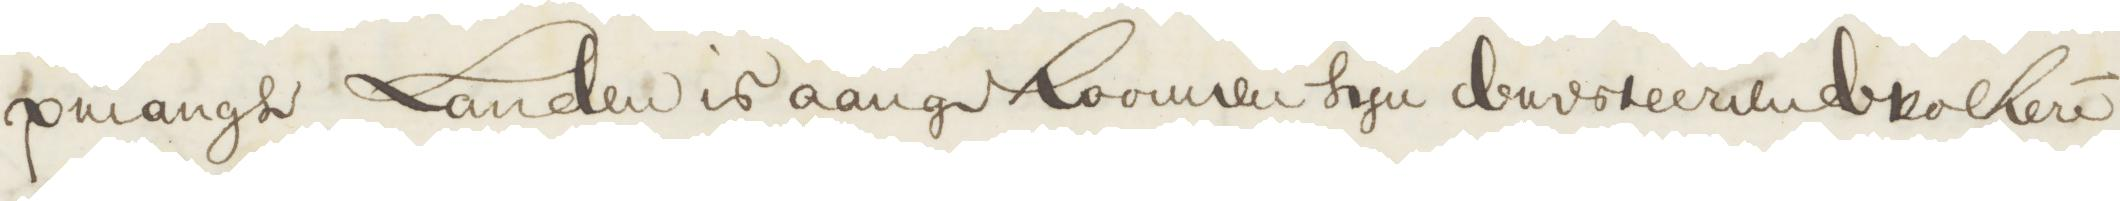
priangse Landen is aangekoomen sijn de resteerende volkere
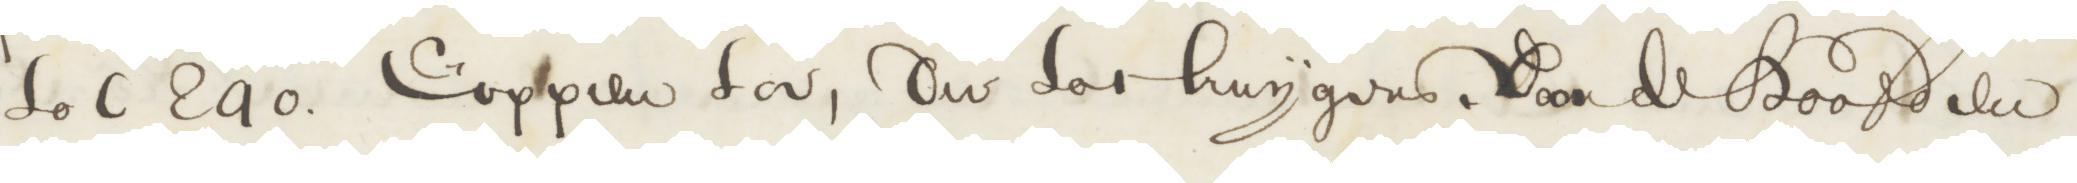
tot 240. Coppen toe, die tot krijgers voor de Hoofden
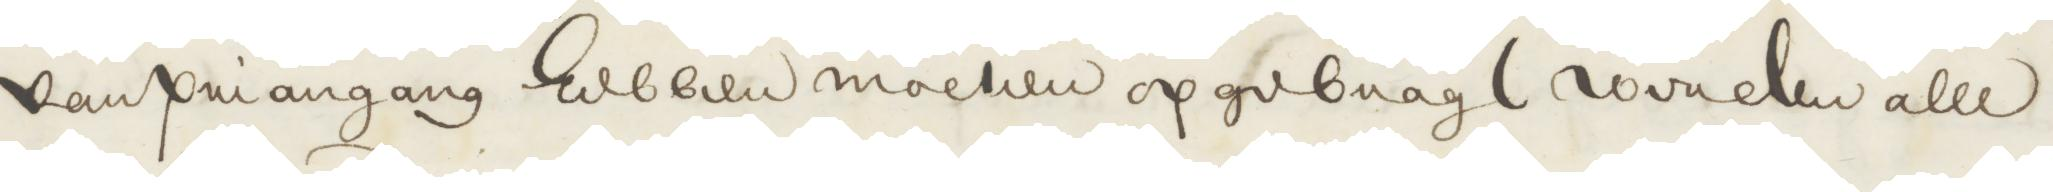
van priangang hebben moeten op gebragt werden alle
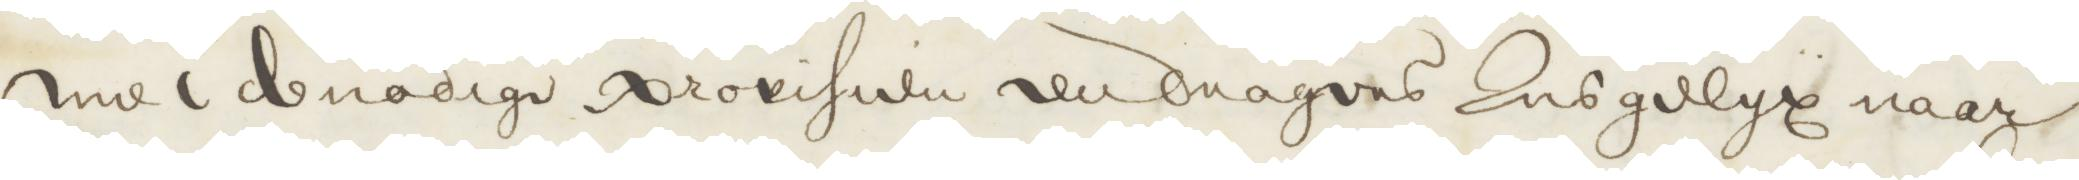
met de nodige provisien en dragers Insgelijx naar
